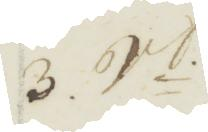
3. v=t
